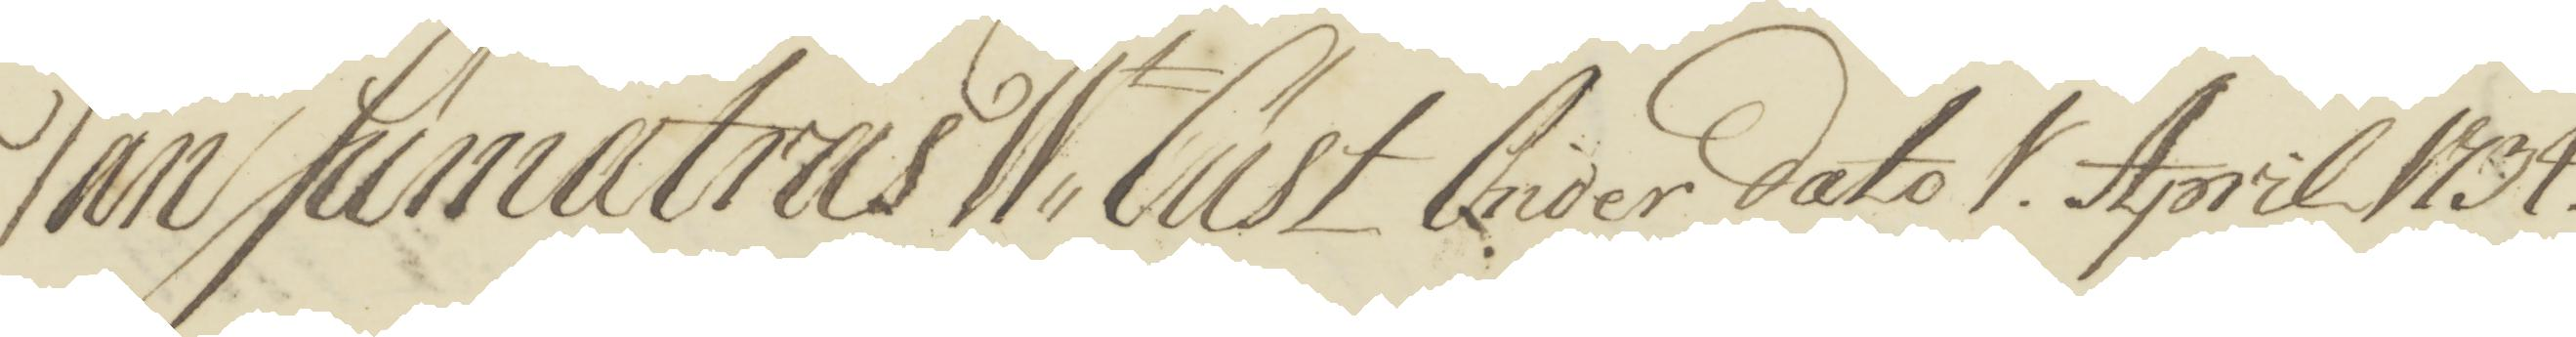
Van Sumatras W„t Cust Onder dato 1. April 1734.
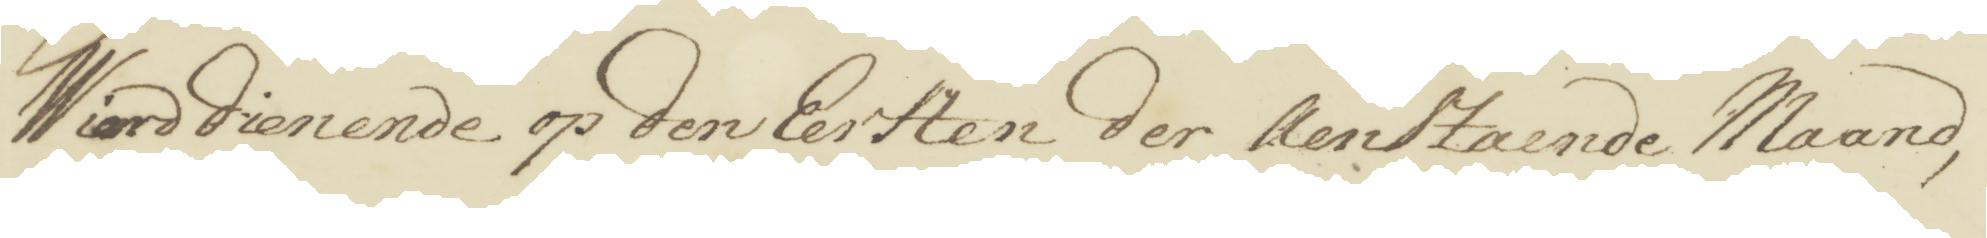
wierd dienende op den Eersten der aenstaende Maand,
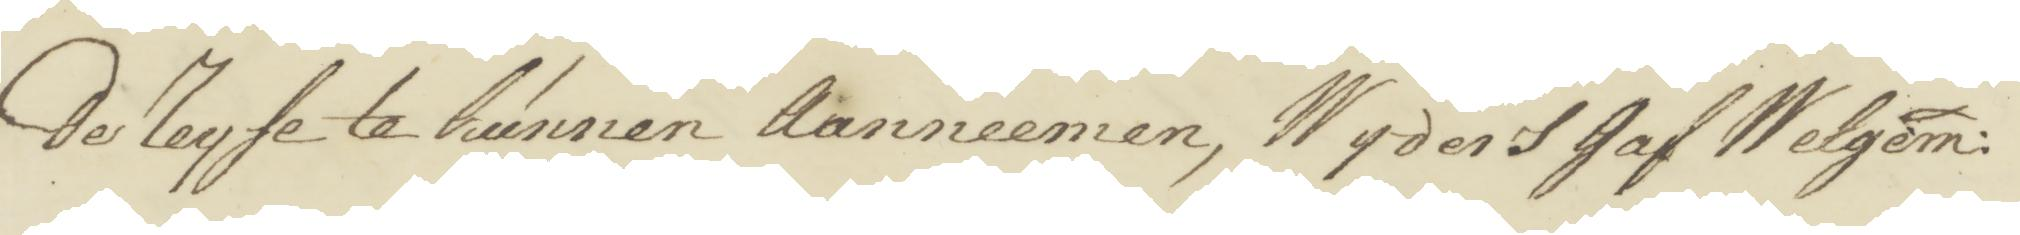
de reyse te kunnen aanneemen, wyders gaf welgem:
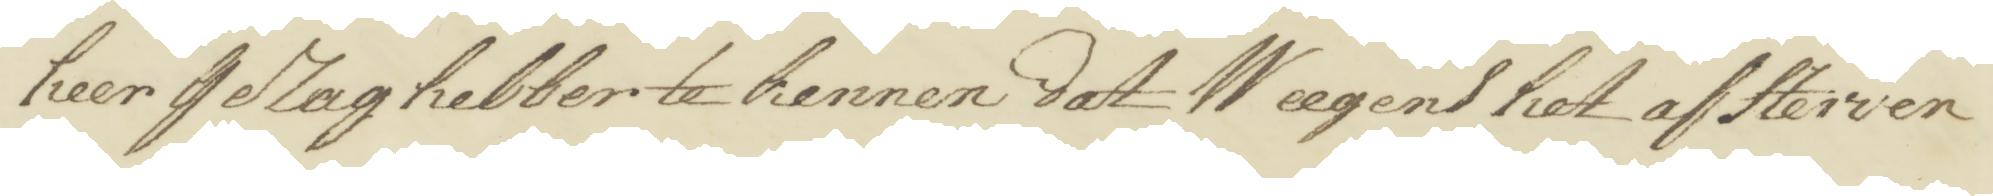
heer gezaghebber te kennen dat weegens het afsterven
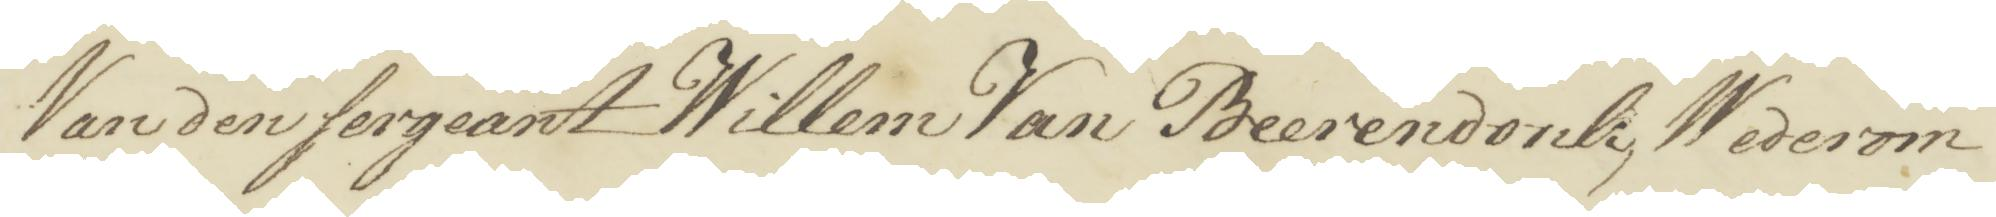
van den sergeant Willem Van Beerendonk, wederom
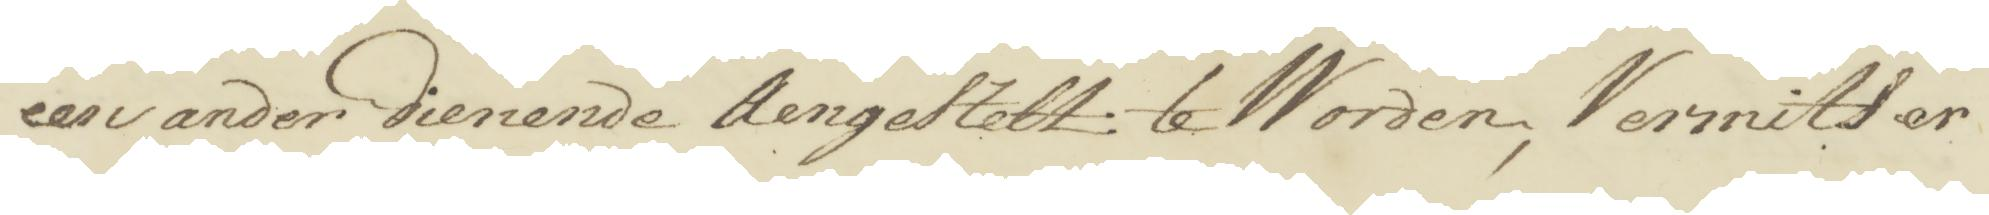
een ander dienende Aengestelt: te worden, vermits er
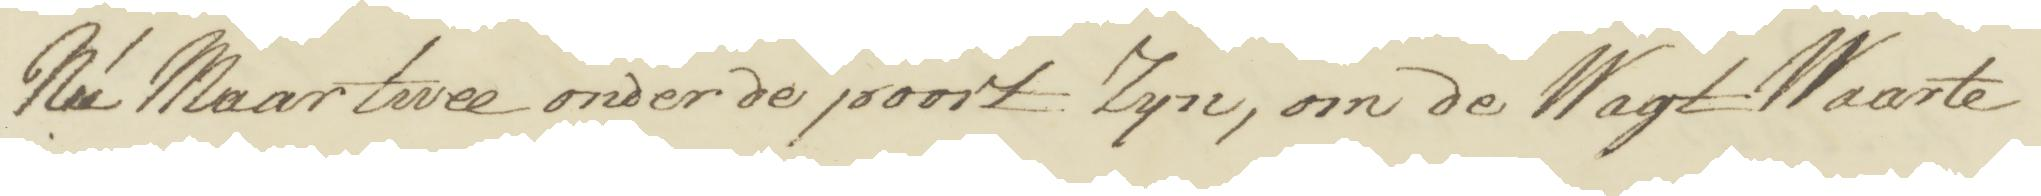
nu maar twee onder de poort zyn, om de wagt waar te
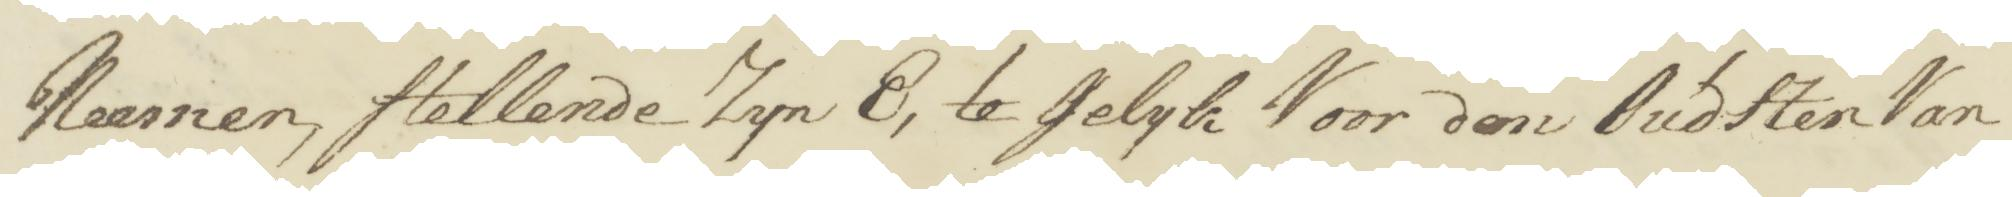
neemen, stellende zyn E, te gelyk voor den oudsten van
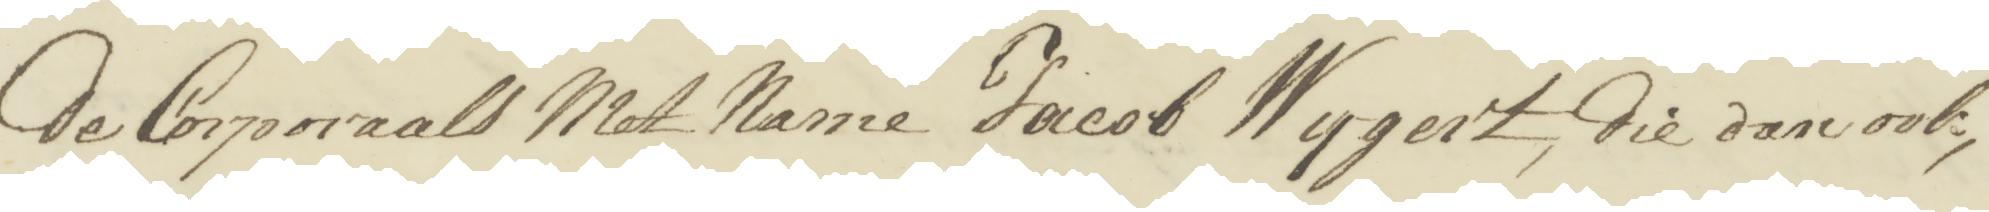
de corporaals met name Jacob Wygert, die dan ook,
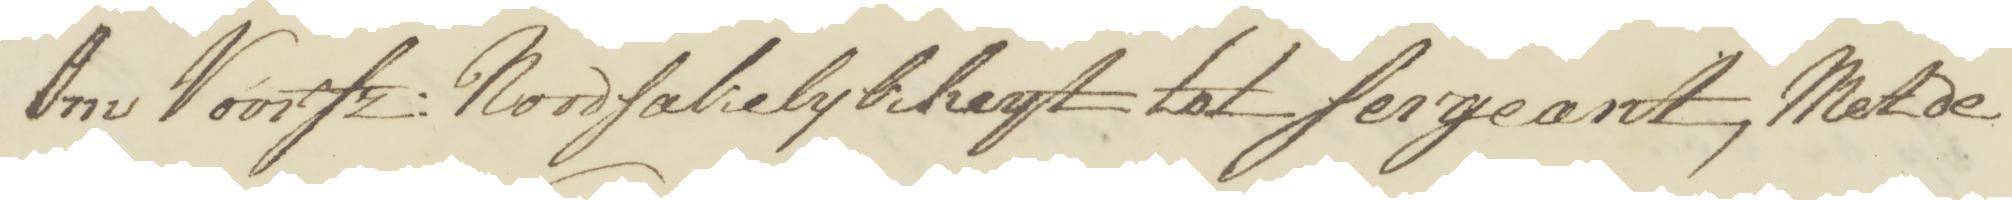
om voorsz: noodsakelykheyt tot sergeant, met de
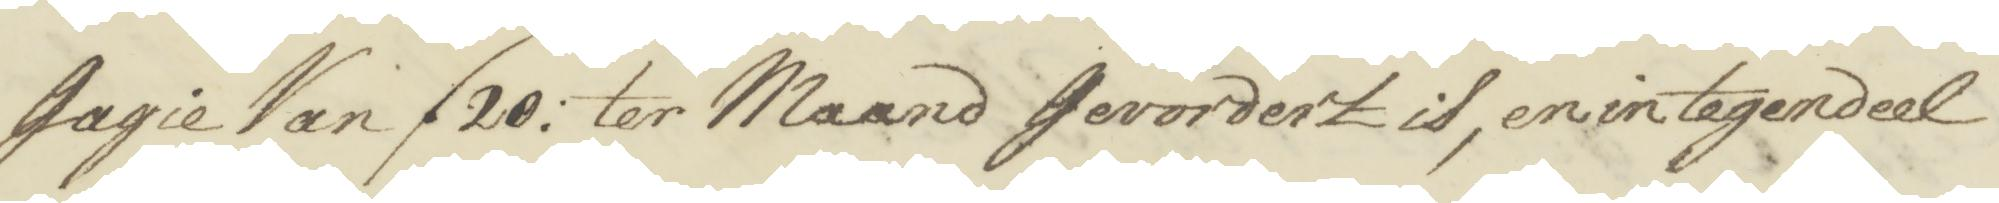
gagie van ƒ20: ter maand gevordert is, en in tegendeel
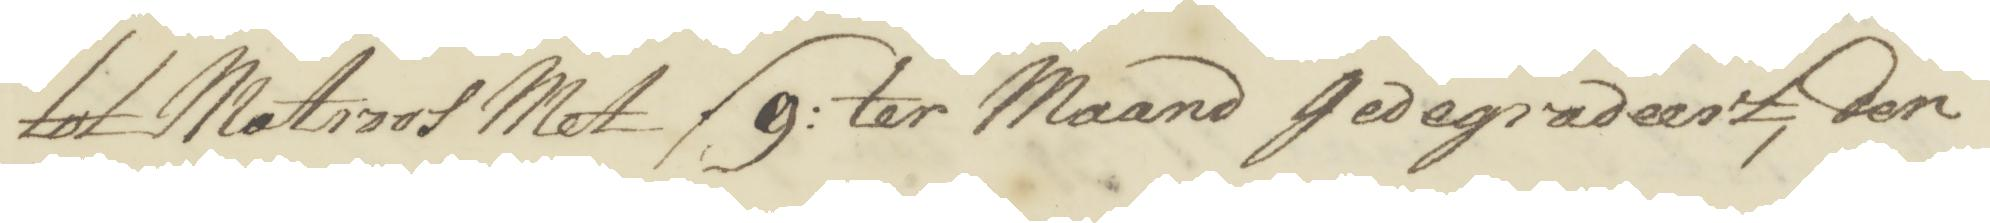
tot matroos met ƒ9: ter maand gedegradeert, den
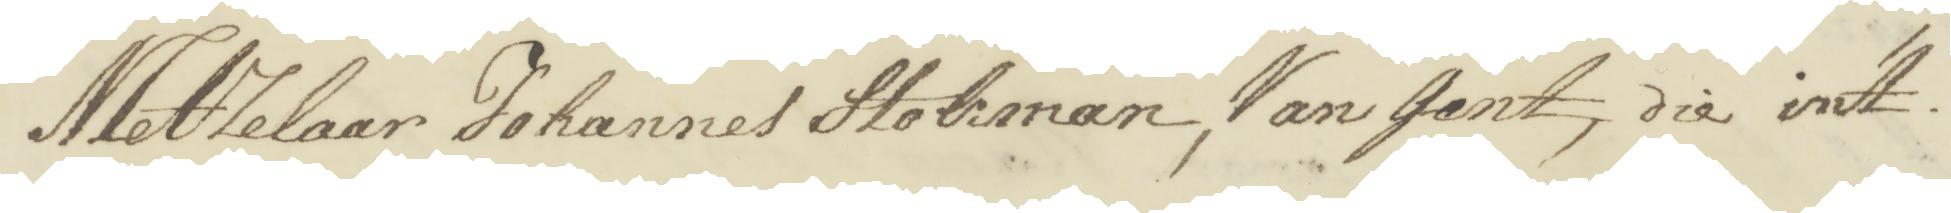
Metzelaar Johannes Slokman, van Gent, die in't
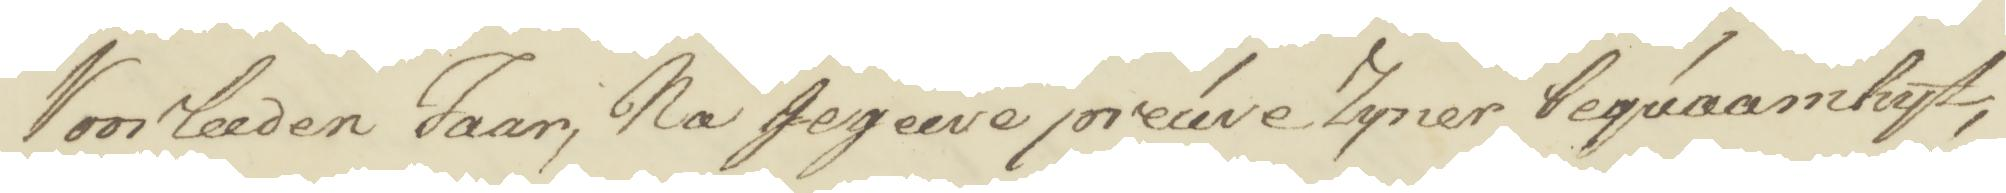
voorleeden jaar, na gegeeve preuve zyner bequaamhyt,
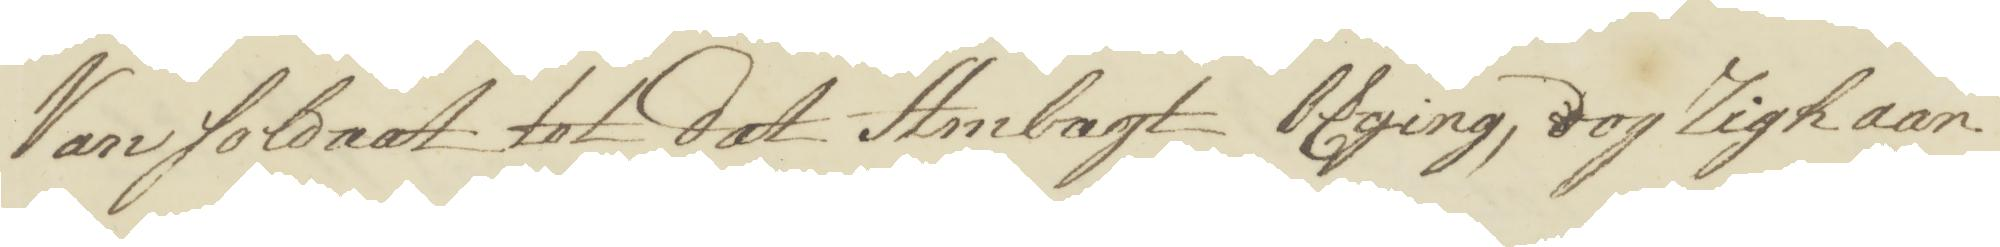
van soldaat tot dat Ambagt overging, dog zigh aan
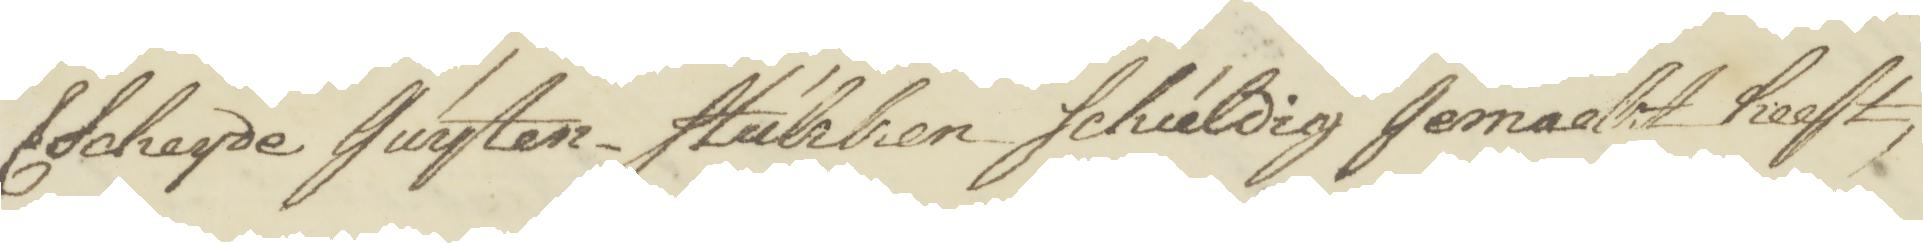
verscheyde guyten-stukken schuldig gemaakt heeft,
